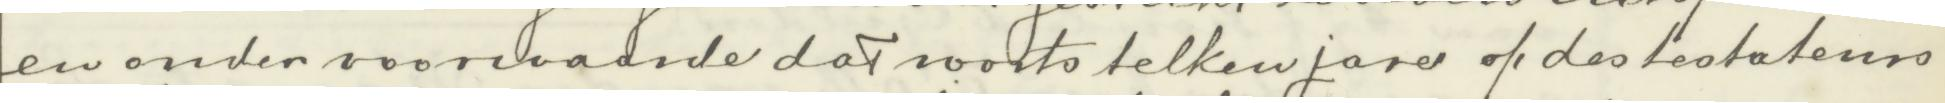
en onder voorwaarde dat voorts telkenjare op des testateurs
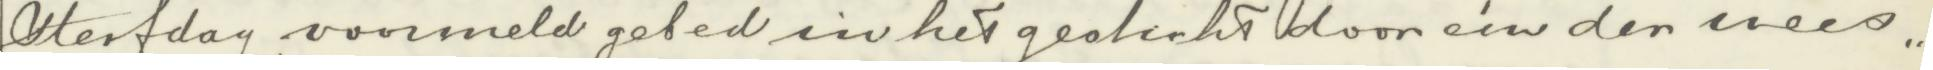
sterfdag voormeld gebed in het gesticht door een der wees„
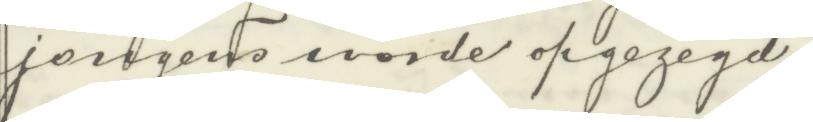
jongens worde opgezegd
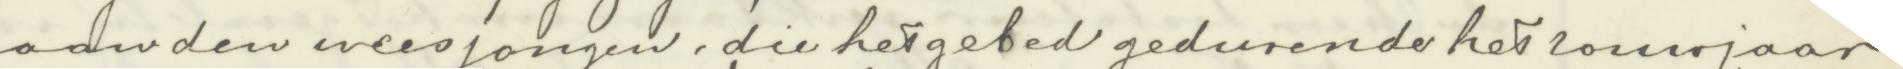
aan den weesjongen, die het gebed gedurende het rouwjaar
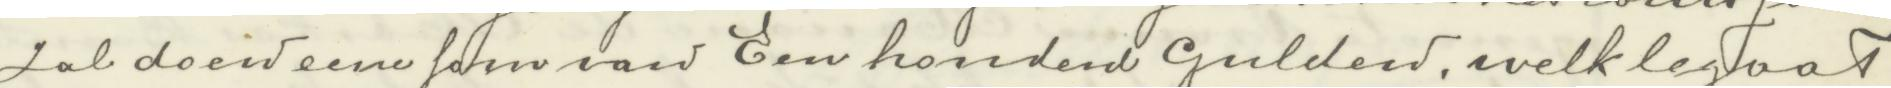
zal doen eene som van Een honderd Gulden, welk legaat
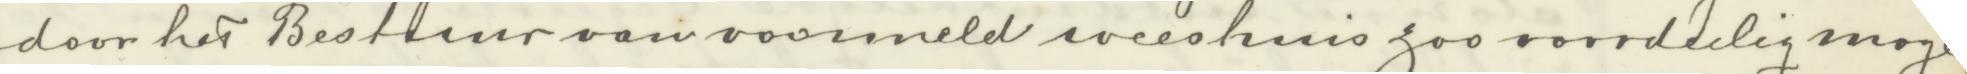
door het Bestuur van voormeld weeshuis zoo voordeelig moge
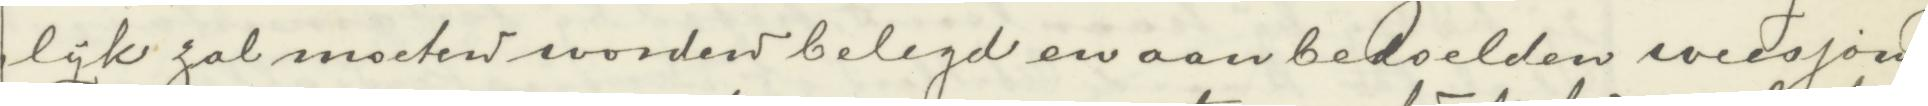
lijk zal moeten worden belegd en aan bedoelden weesjon
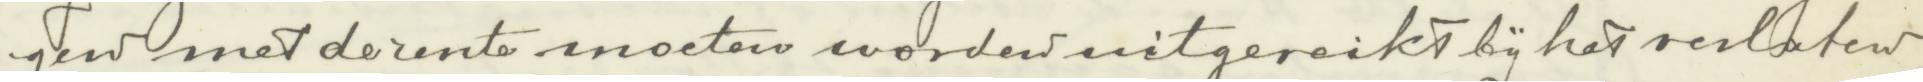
gen met de rente moeten worden uitgereikt bij het verlaten
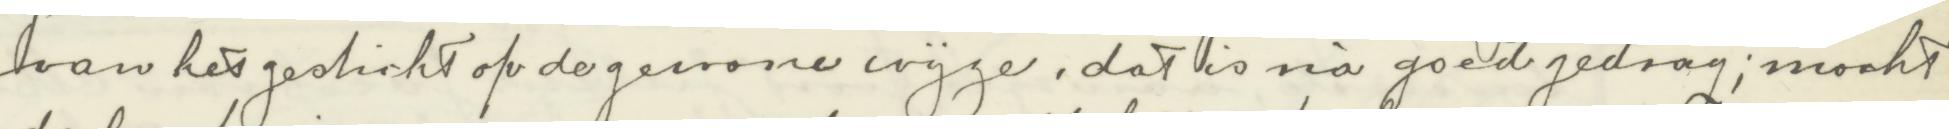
van het gesticht op de gewone wijze, dat is na goed gedrag; mocht
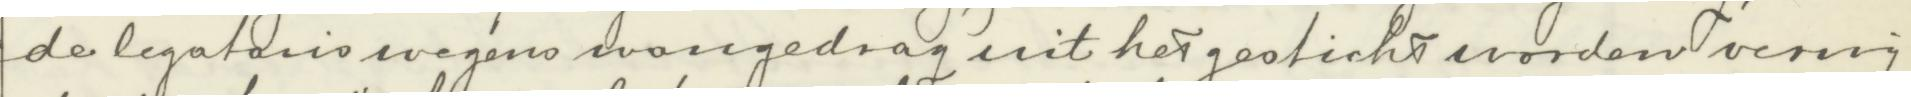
de legataris wegens wangedrag uit het gesticht worden verwij
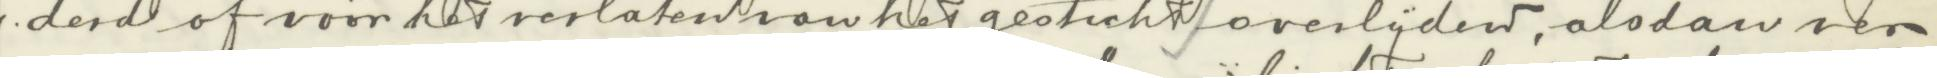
derd of vóór het verlaten van het gesticht] overlijden, als dan ver
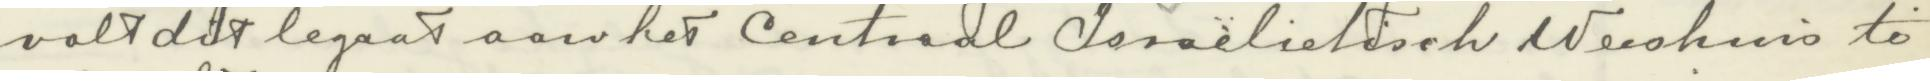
valt dit legaat aan het Centraal Israëlietisch Weeshuis te
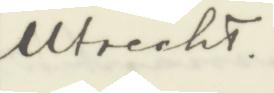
Utrecht.
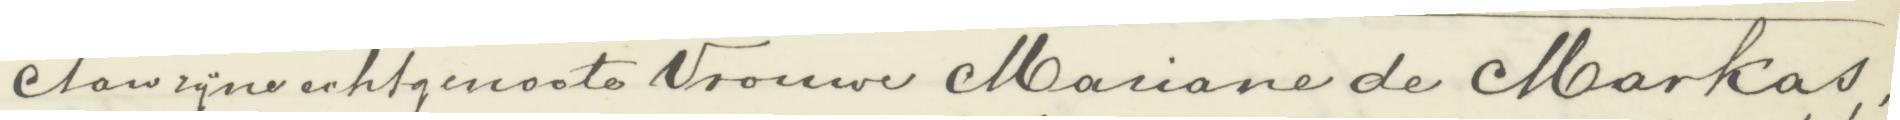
Aan zijne echtgenoote Vrouwe Mariane de Markas,
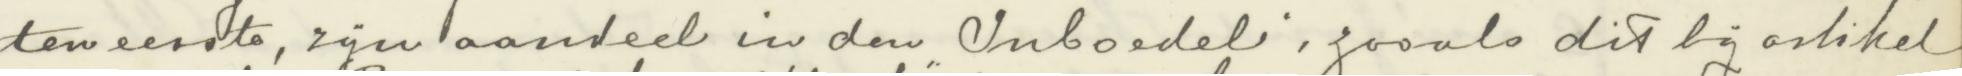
ten eerste, zijn aandeel in den Inboedel, zoo als dit bij artikel
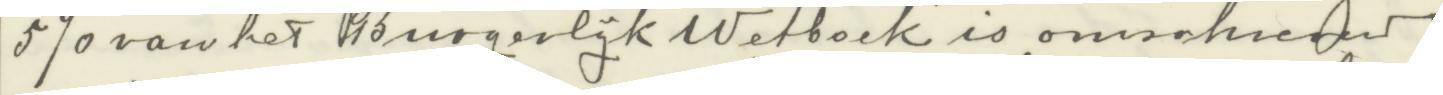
570 van het Burgerlijk Wetboek is omschreven.
